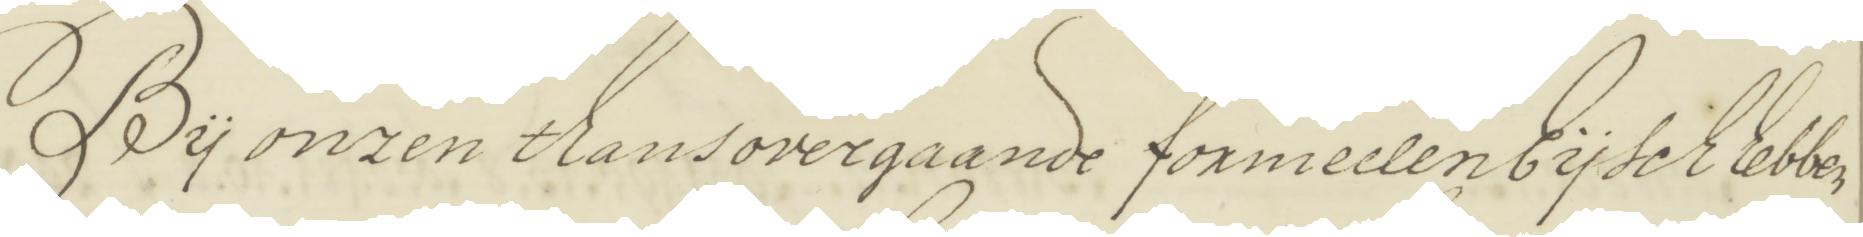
Bij onzen thans overgaande formeelen Eijsch hebben
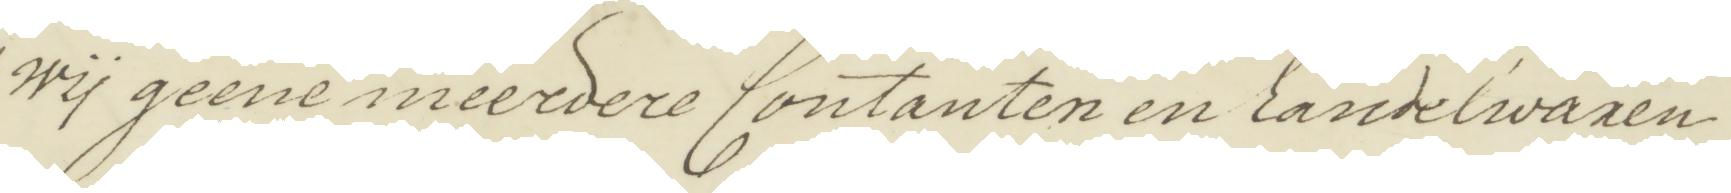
wij geene meerdere Contanten en handelwaren
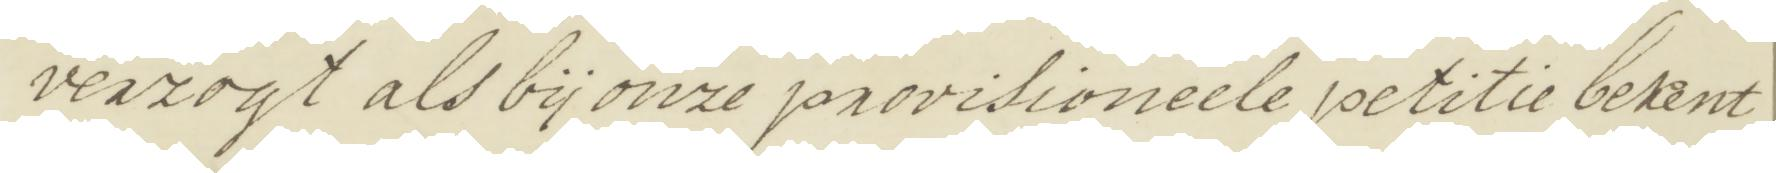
verzogt als bij onze provisioneele petitie bekent
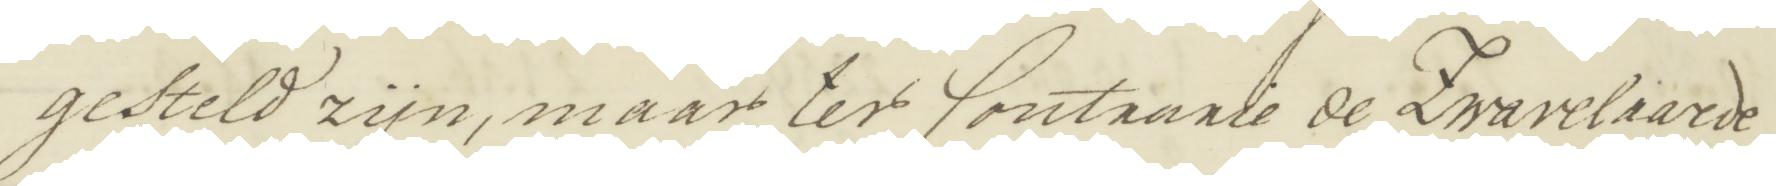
gesteld zijn, maar ter Contrarie de Zwavelaarde
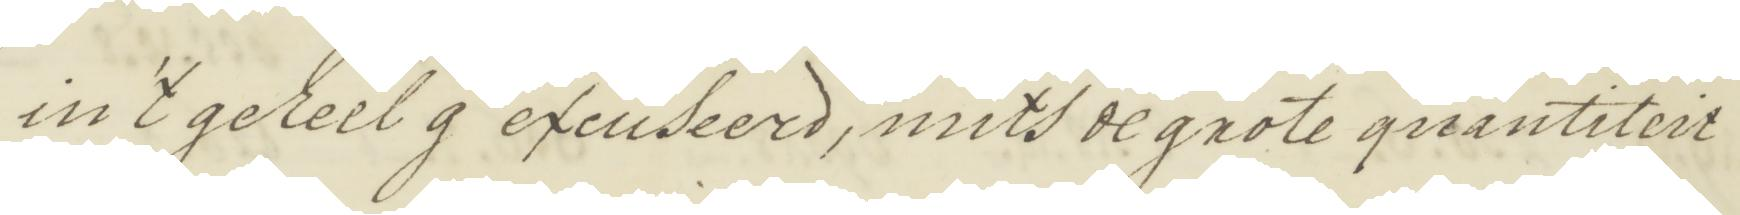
in ’t geheel g’excuseerd, mits de grote quantiteit
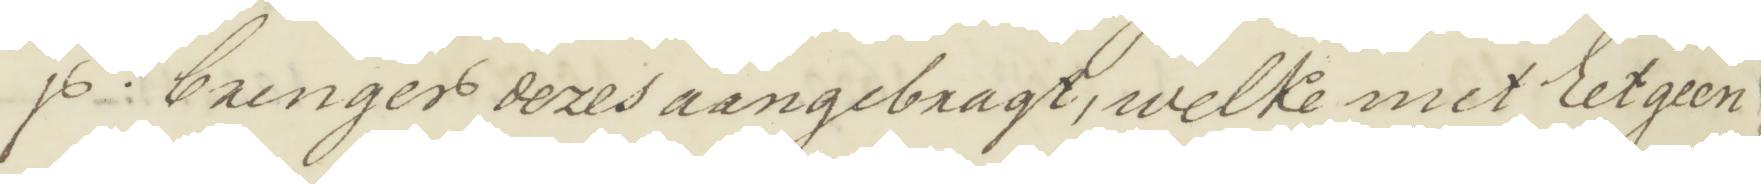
p:r brenger dezes aangebragt, welke met hetgeen
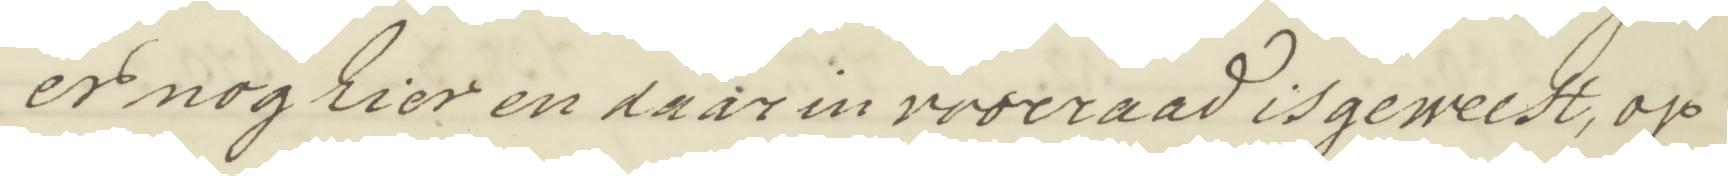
er nog hier en daar in voorraad is geweest, op
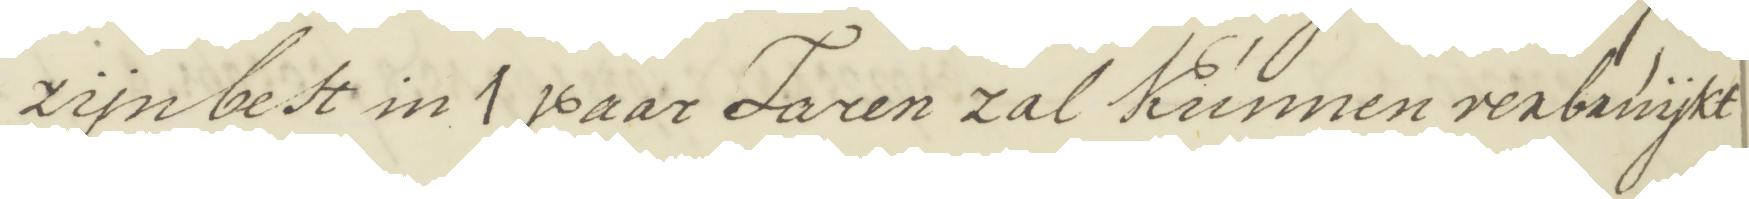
zijn best in 1 paar Iaren zal kunnen verbruijkt
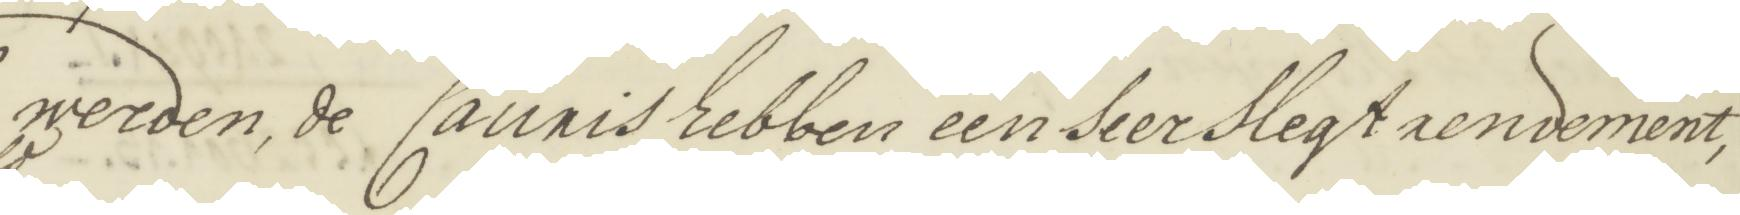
werden, de Cauris hebben een Seer Slegt rendement,
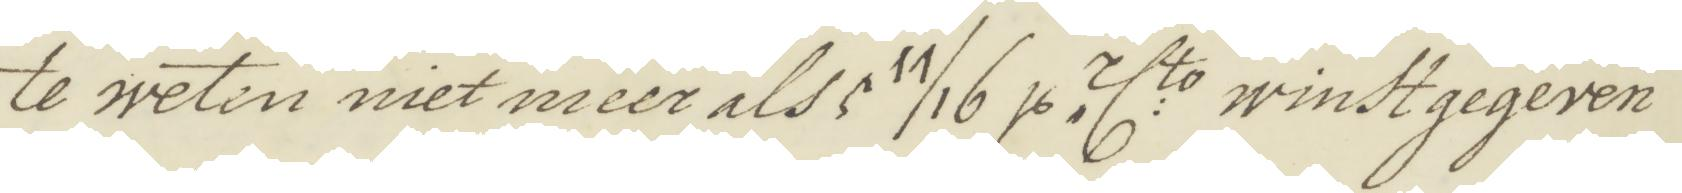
te weten niet meer als 5 11/16 p„r C:to winst gegeven
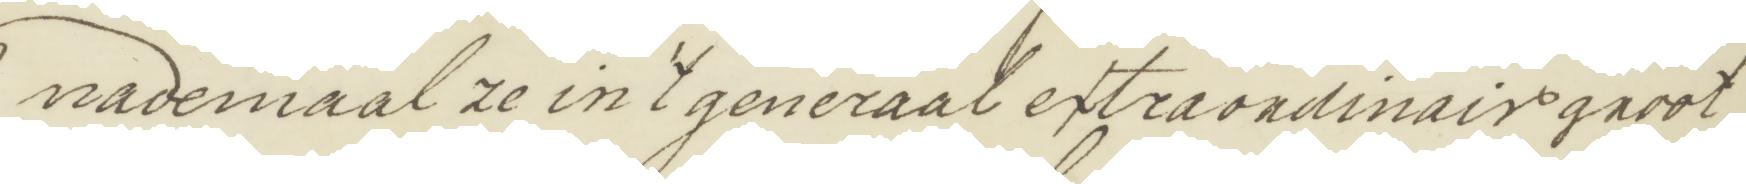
nademaal ze in ’t generaal extraordinair groot
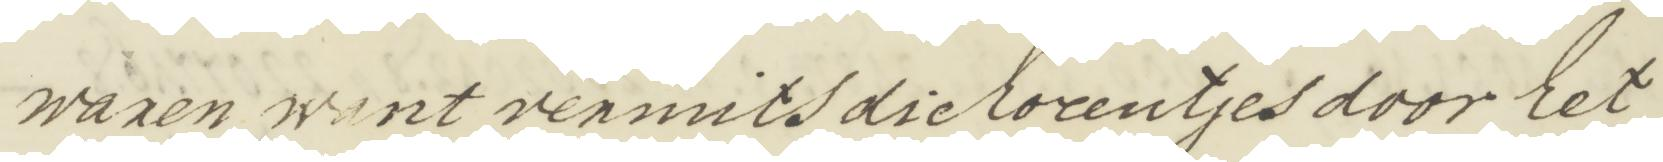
waren want vermits die horentjes door het
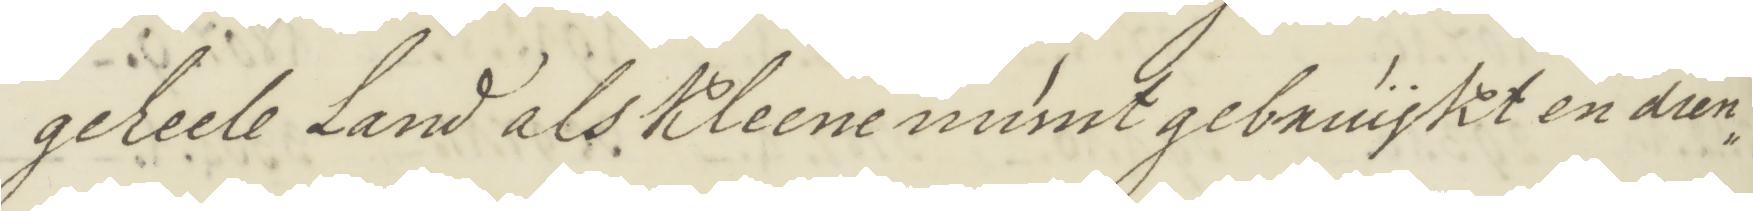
geheele Land als kleene munt gebruijkt en dien„
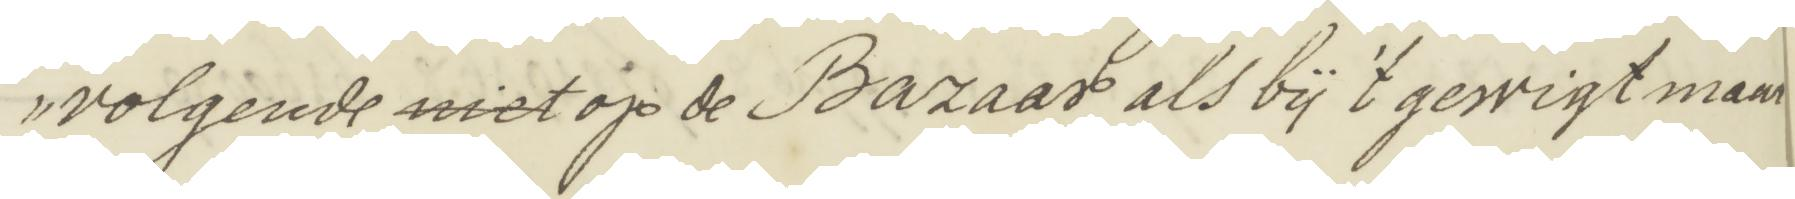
„volgende niet op de Bazaar als bij ’t gewigt maar
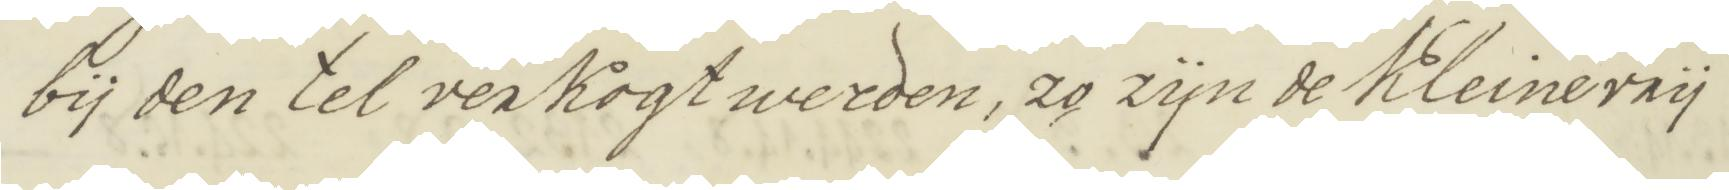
bij den tel verkogt werden, zo zijn de Kleine vrij
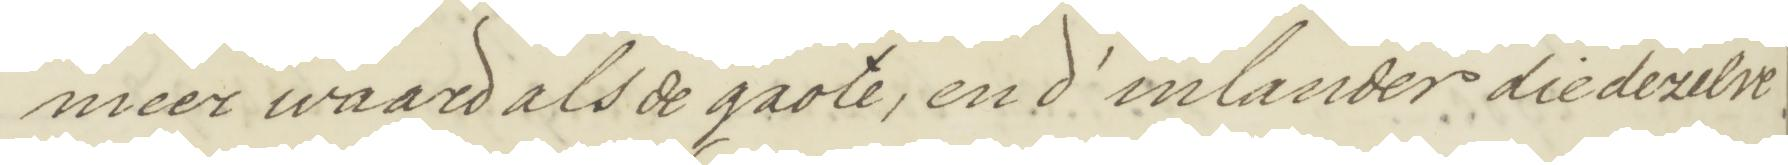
meer waard als de grote, en d’ inlander die dezelve
